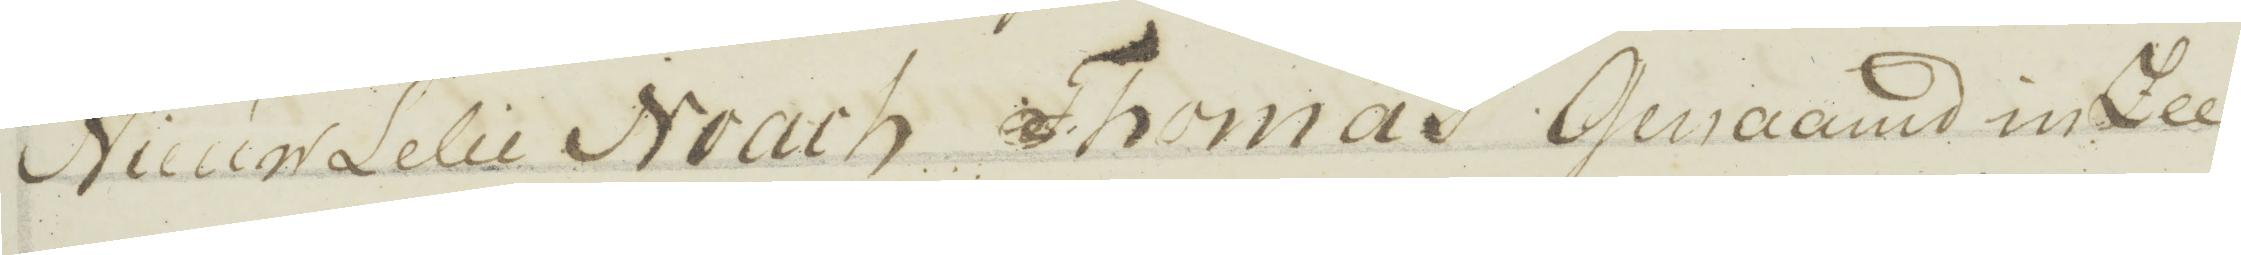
Nieuw Lelie Noach Thomas Genaamd in Zee
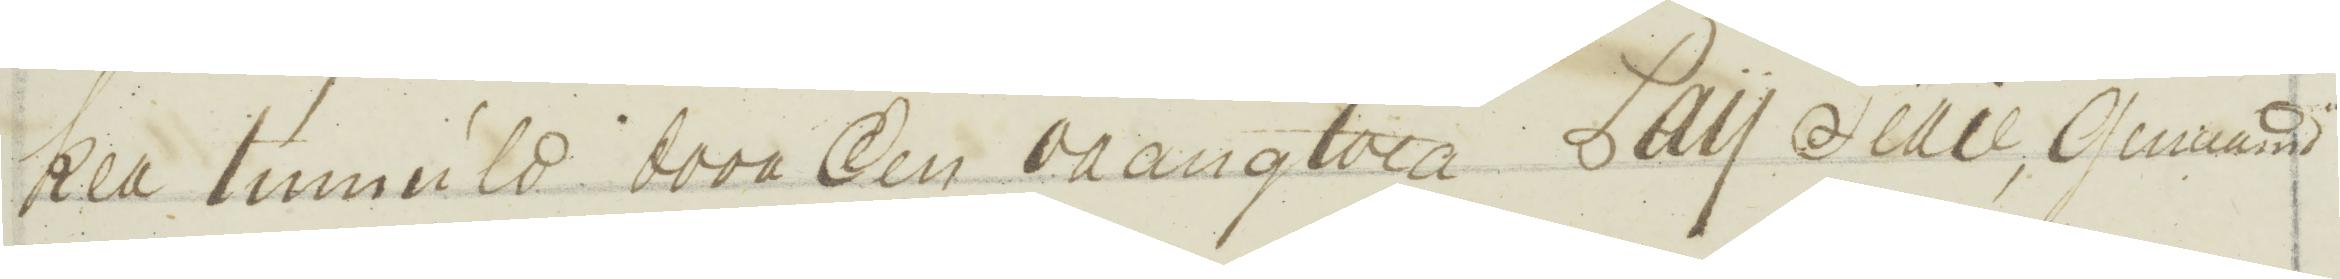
ker tumuld door Een Orangtoea Paij Terie, Genaamd
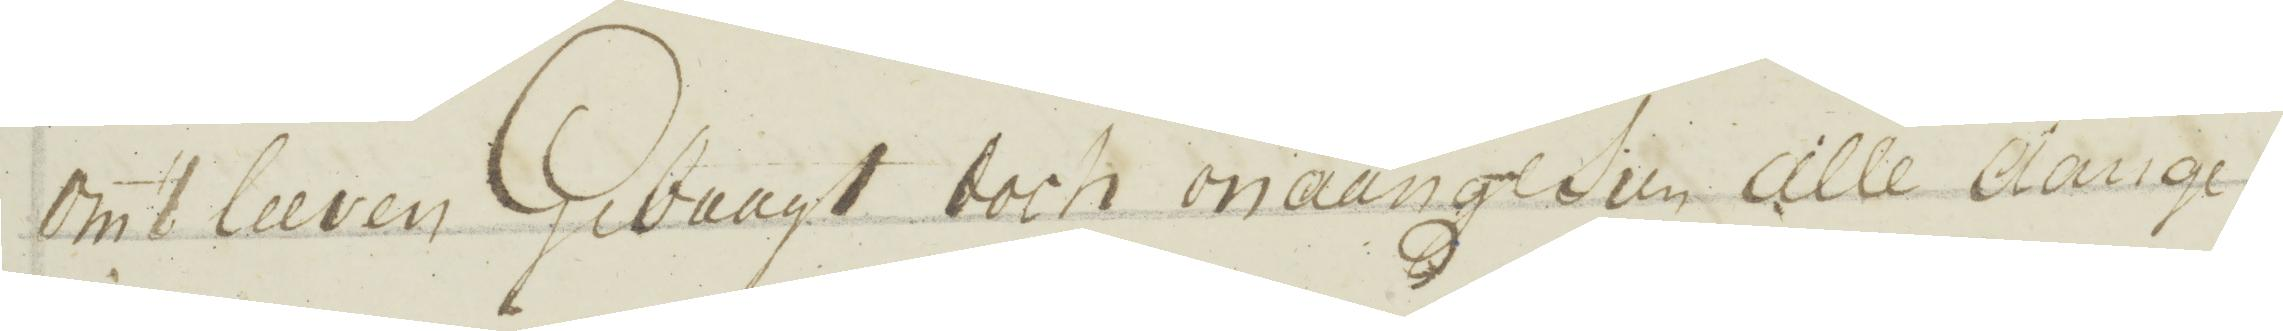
om 't leeven Gebragt doch on aangesien alle aange
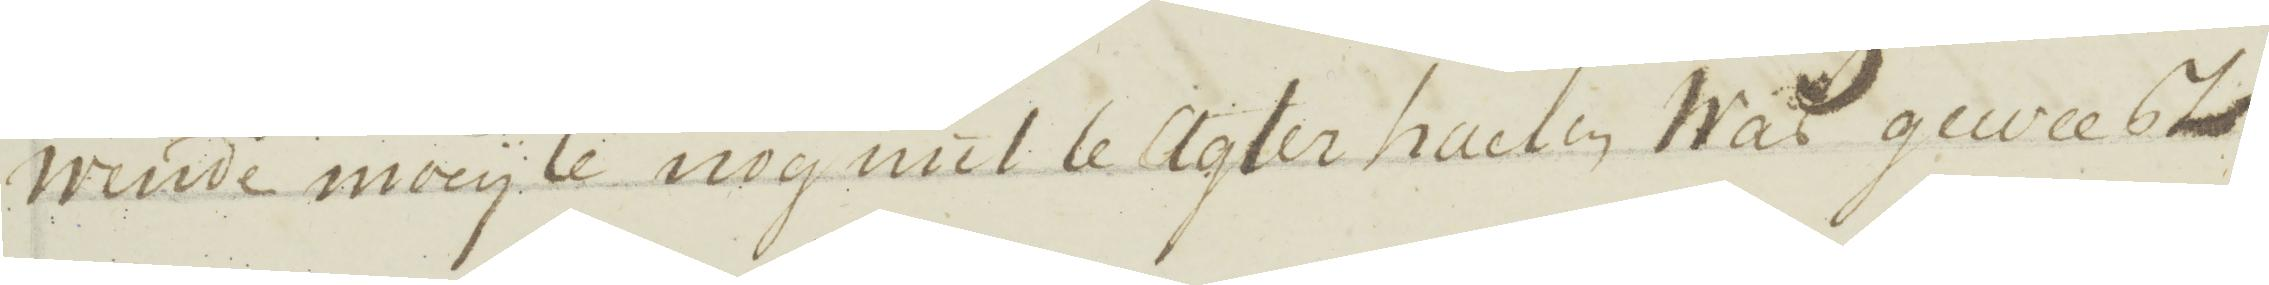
wende moeijte nog niet te Agter haelen was geweest
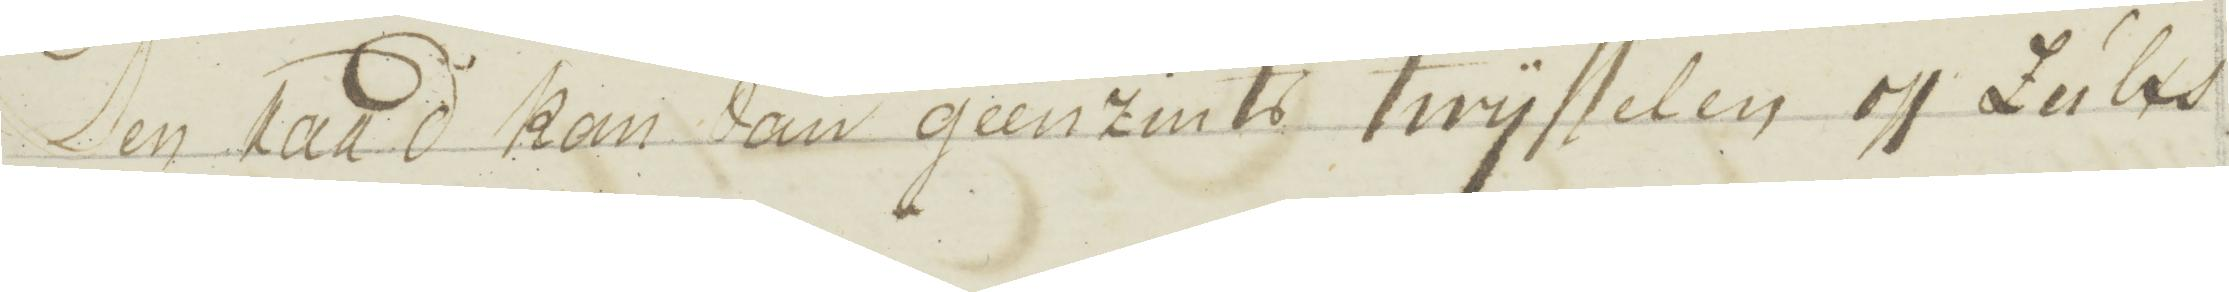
Den hard kan dan geenzints twijffelen op zulxs
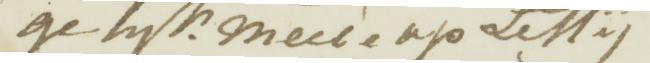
gelyk meede op Settij
